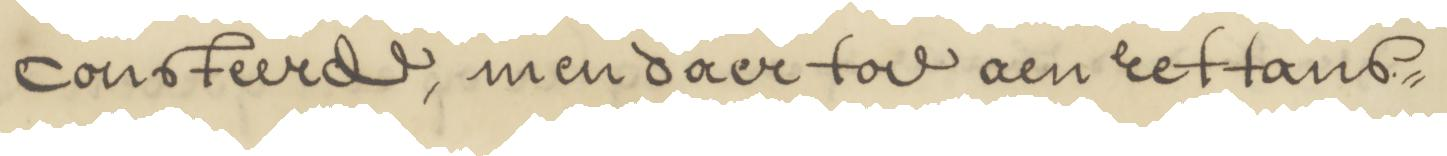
consteerde, men daer toe aen het tans„
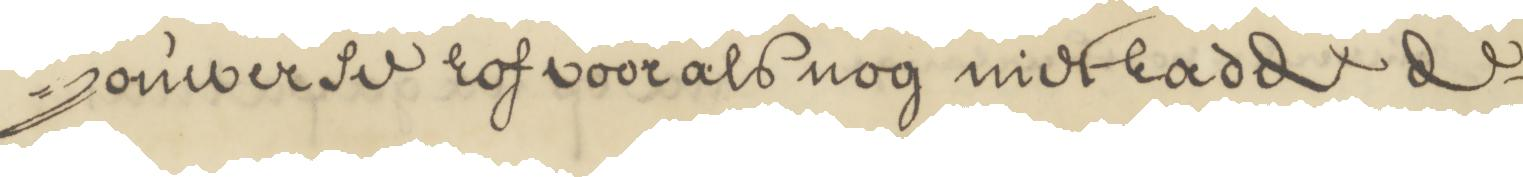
„jouwerse hof voor als nog niet hadde de
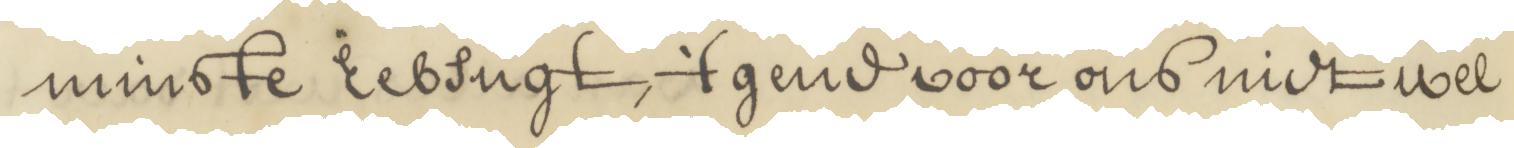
minste hebsugt, ’t gene voor ons niet wel
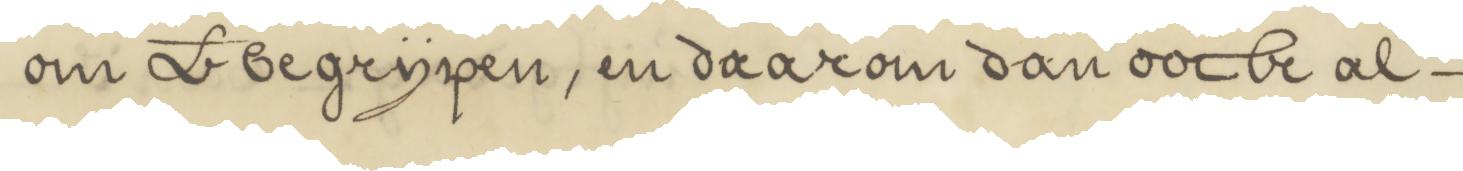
om te begrijpen, en daarom dan oock al
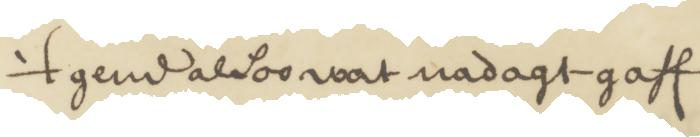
’t gene alsoo wat nadagt gaff
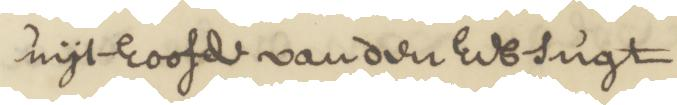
uijt hoofde van den hebsugt
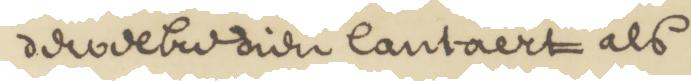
dewelke dien lantaert als
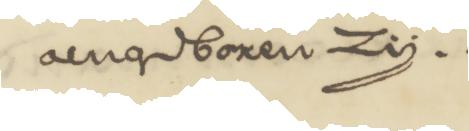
aengeboren zij.
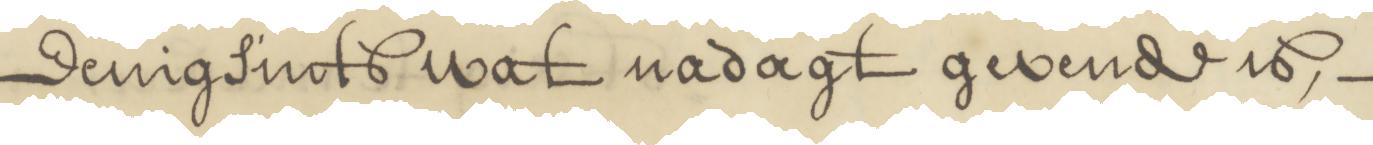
Eenigsints wat nadagt gevende is,
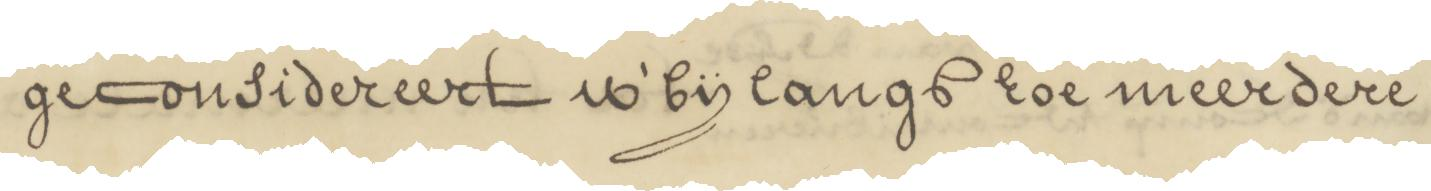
geconsidereert w'bij langs hoe meerdere
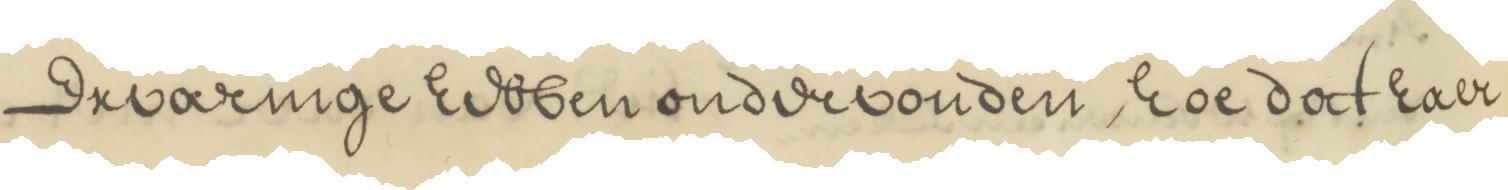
Ervaringe hebben ondervonden, hoe dat haer
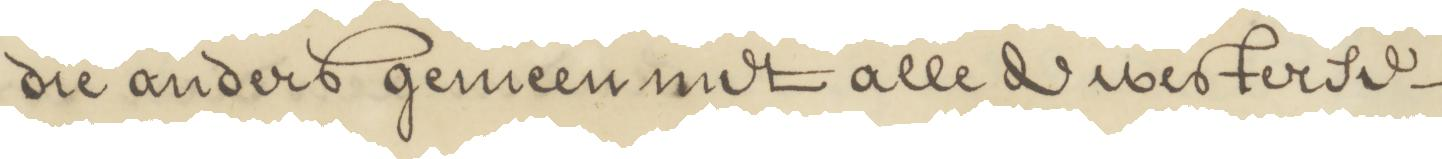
die anders gemeen met alle de westerse
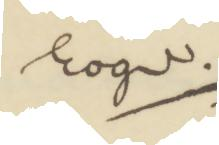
hoge.
